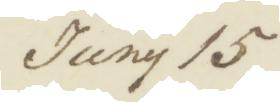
Iuny 15
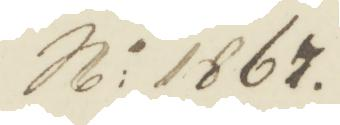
N:o 1867.
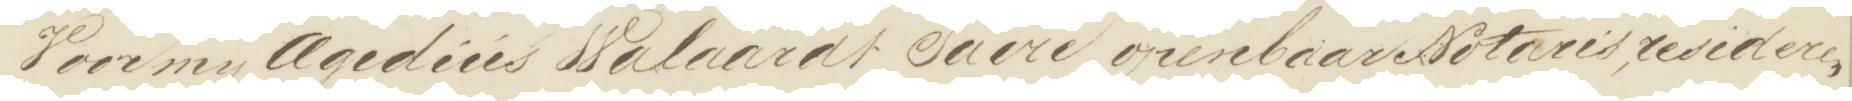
Voor my AEgidius Walaardt Sacré openbaar Notaris resideren
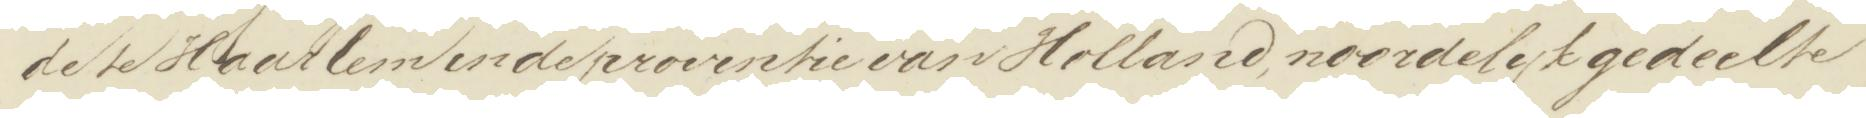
de te Haarlem, in de provintie van Holland, noordelyk gedeelte
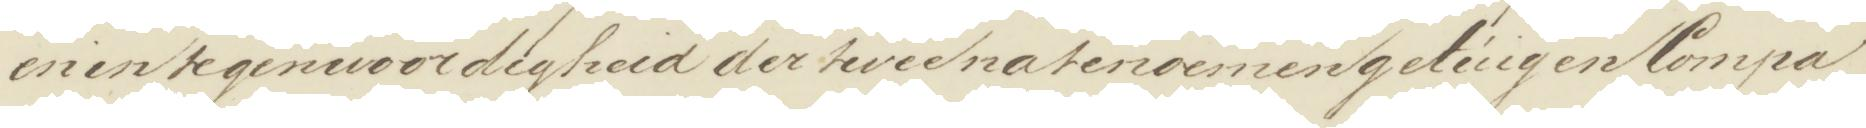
en in tegenwoordigheid der twee na te noemen getuigen, Compa
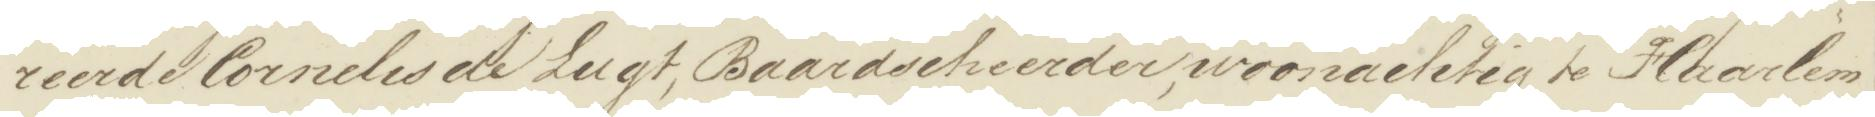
reerde Cornelis de Lugt, Baardscheerder woonachtig te Haarlem
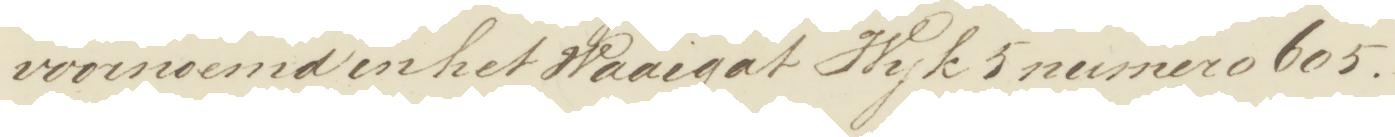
voornoemd in het Waaigat Wyk 5 numero 605.
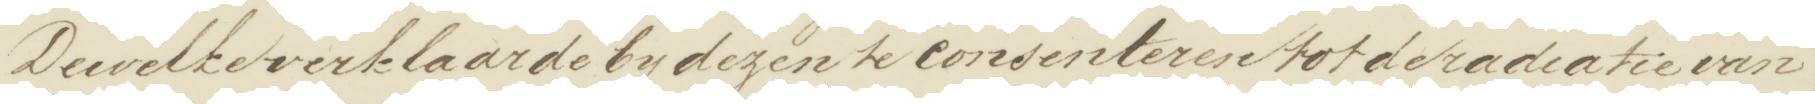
Dewelke verklaarde by dezen te consenteren tot de radiatie van
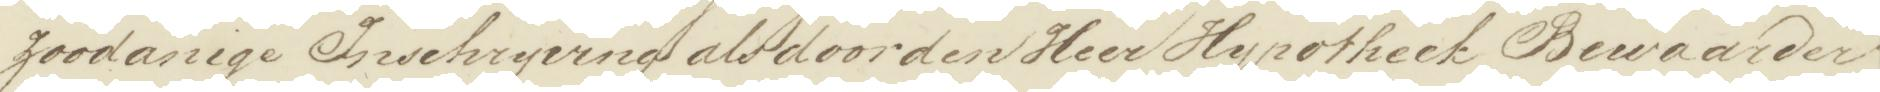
zoodanige Inschryving als door den Heer Hypotheek Bewaarder
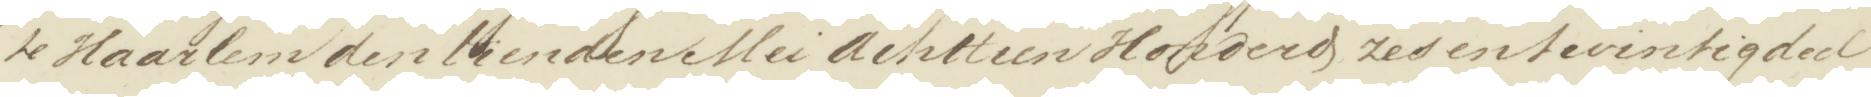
te Haarlem den tienden Mei achttien Honderd, zes en twintig deel
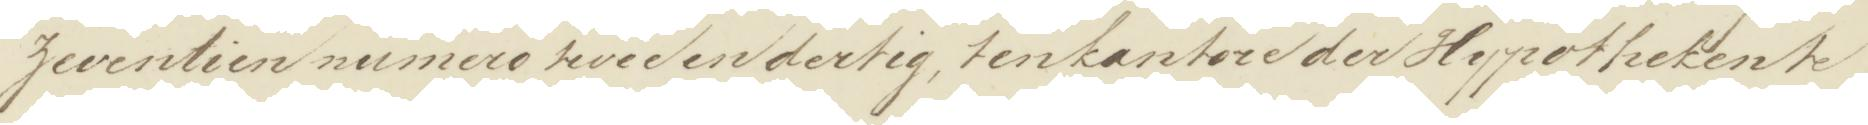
Zeventien numero twee en dertig, ten kantore der Hypotheken te
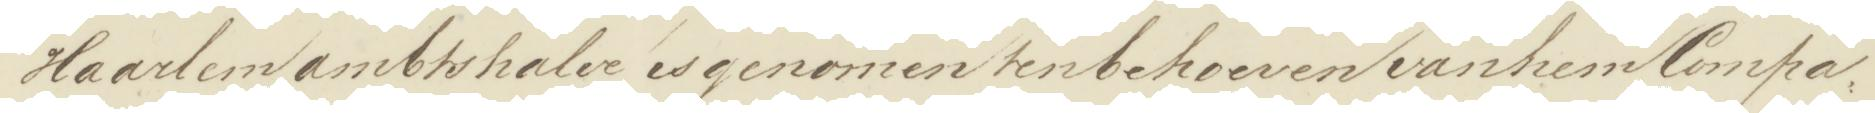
Haarlem ambtshalve is genomen ten behoeven van hem Compa„
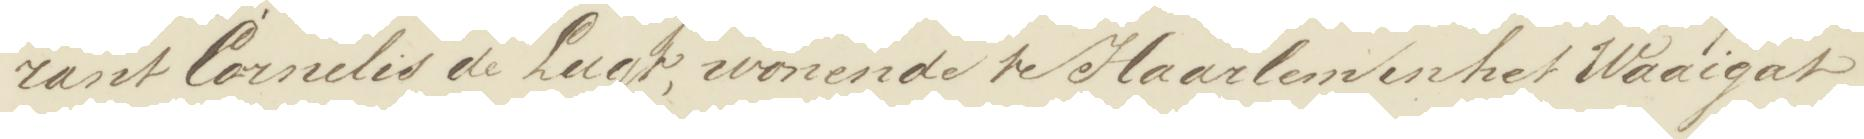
rant Cornelis de Lugt, wonende te Haarlem in het Waaigat
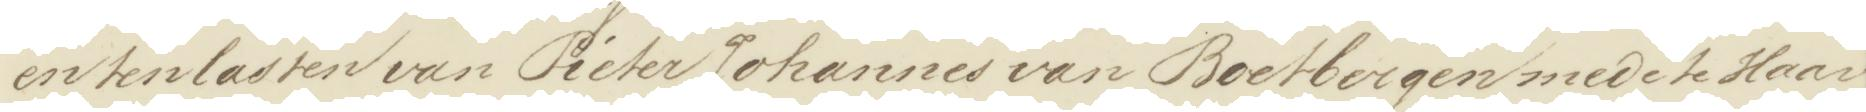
en ten lasten van Pieter Johannes van Boetbergen mede te Haar
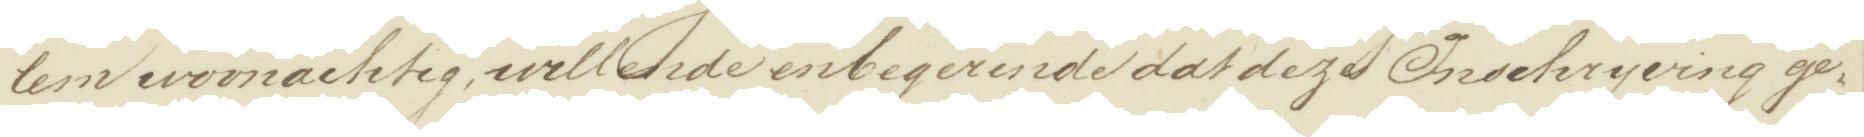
lem woonachtig, willende en begerende dat deze Inschryving ge„
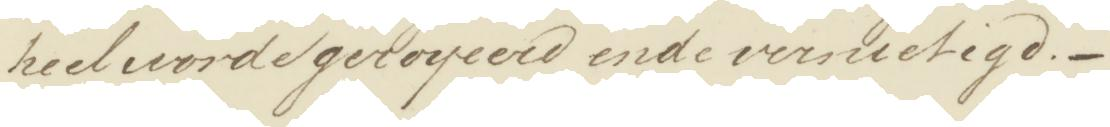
heel worde geroyeerd ende vernietigd.-
